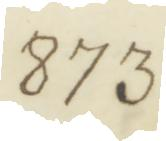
873
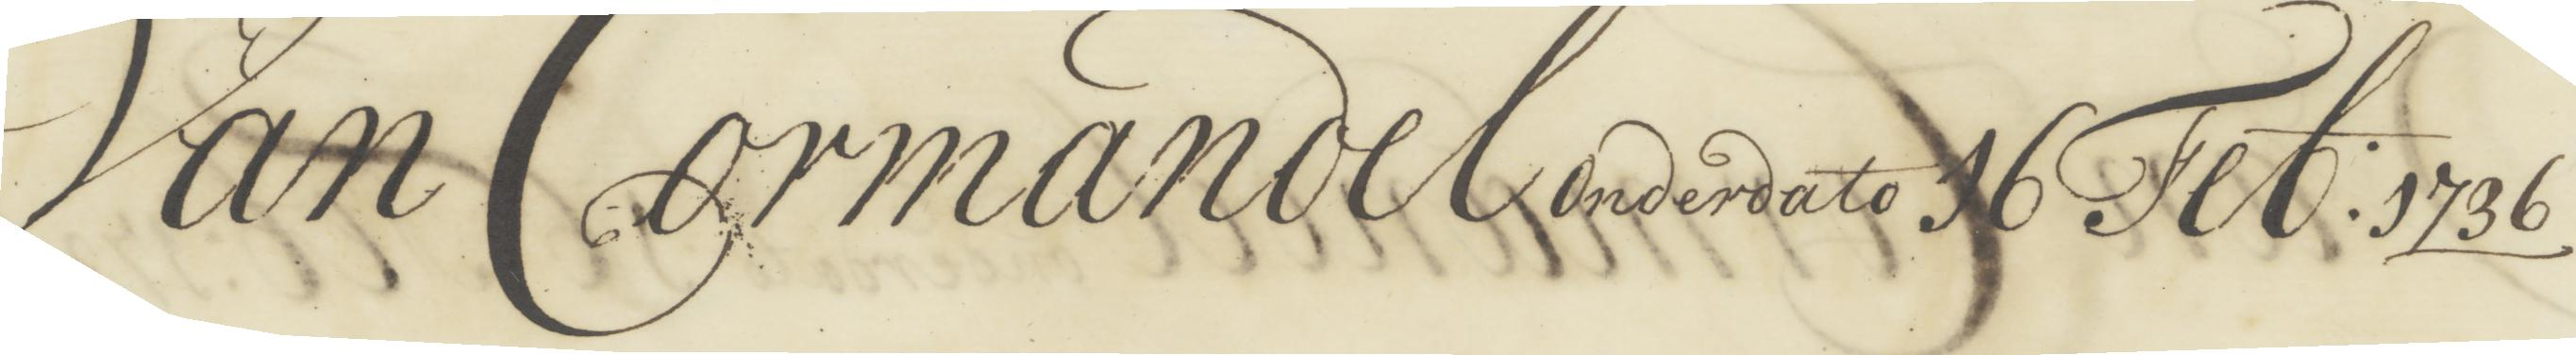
Van Cormandel onderdato 16 Feb: 1736
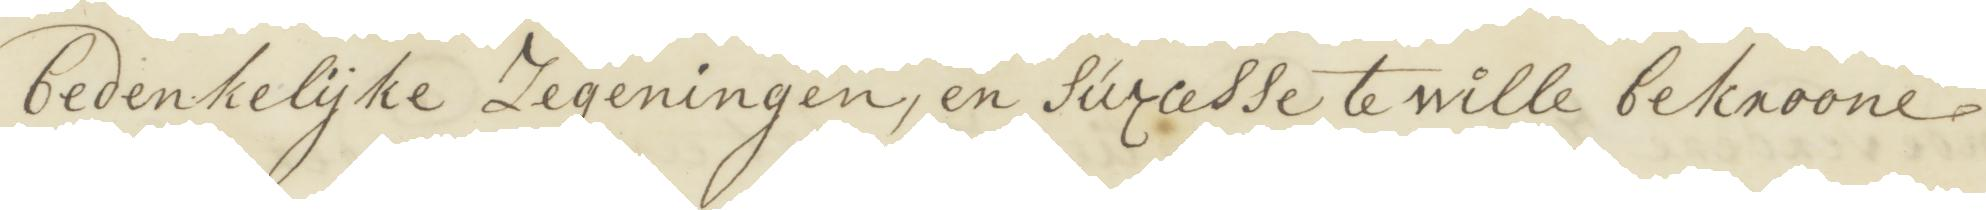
bedenkelijke zegeningen, en suxcesse te wille bekroone
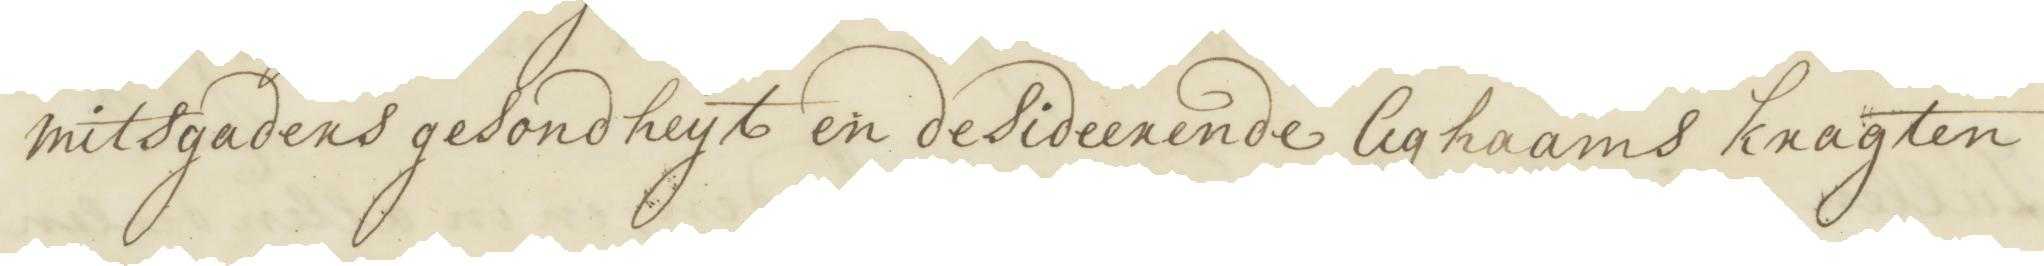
mitsgaders gesondheyt en desideerende lighaams kragten
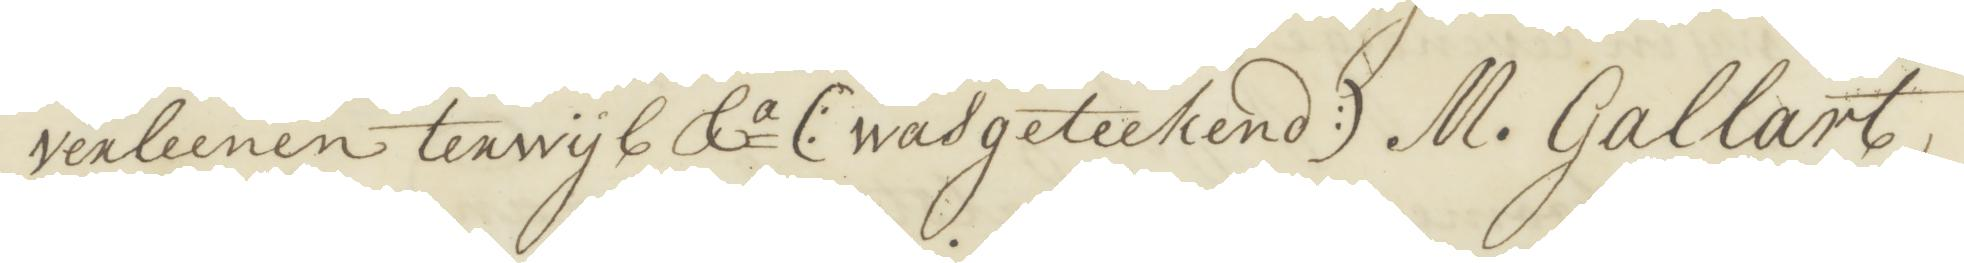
verleenen terwijl &=a (:was geteekend:) M. Gallart,
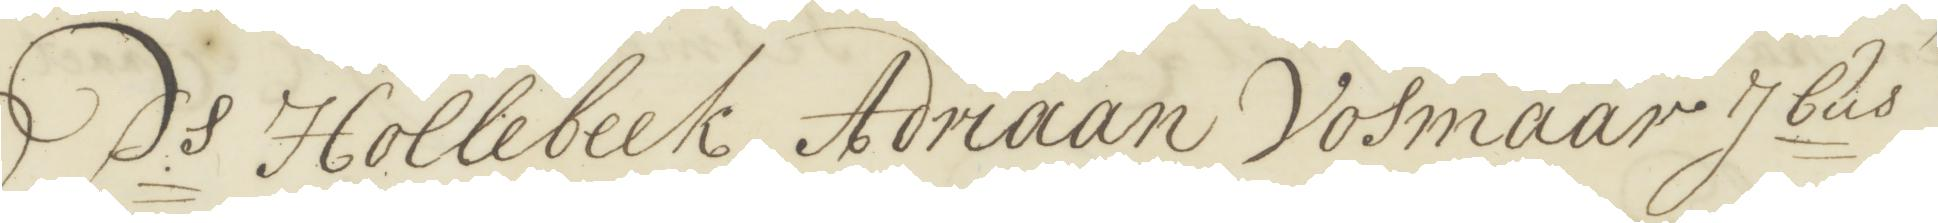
P=s Hollebeek, Adriaan Vosmaar J=bus
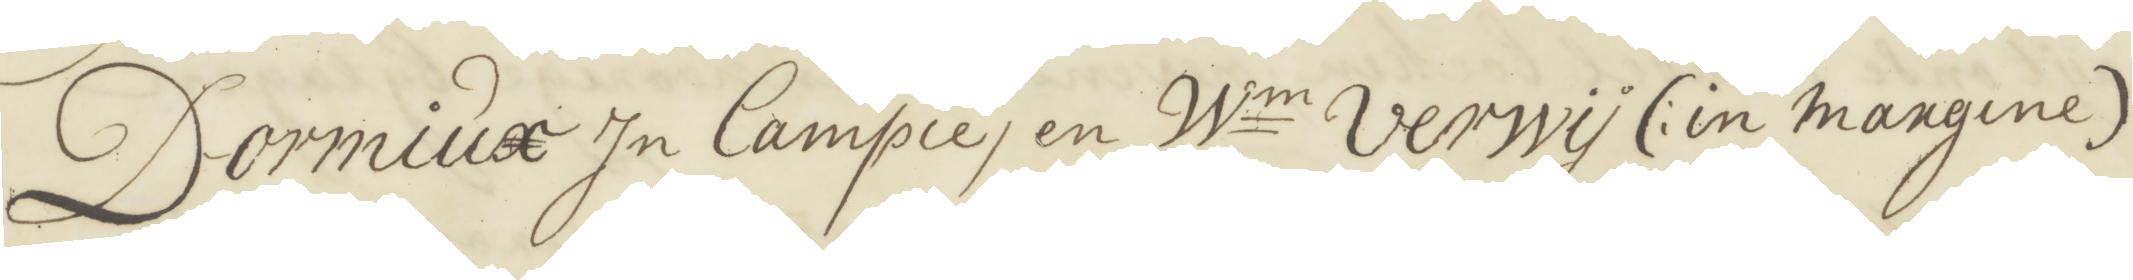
Dormiux Jn Campie, en W=m verwij (:in margine:)
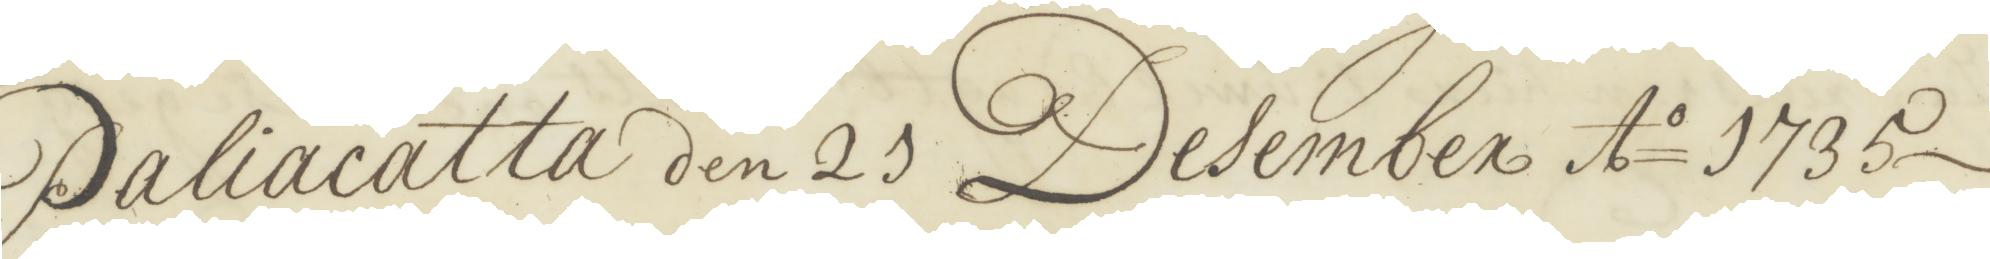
Paliacatta den 21 Desember A=o 1735 —
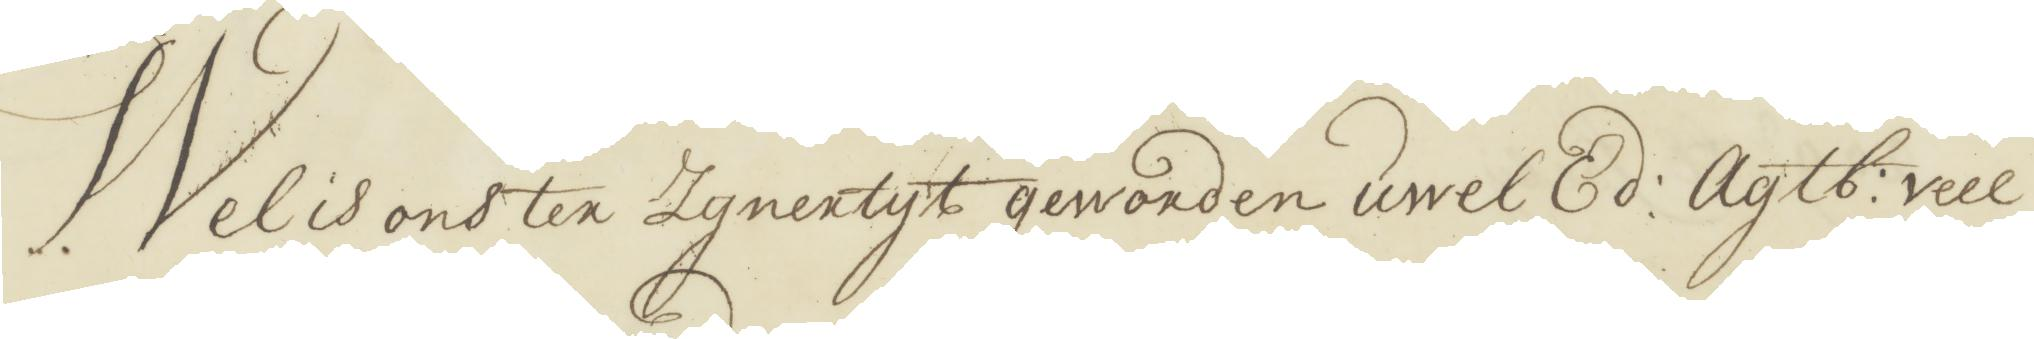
Wel is ons ter zynertyt geworden uwel Ed: Agtb: veel
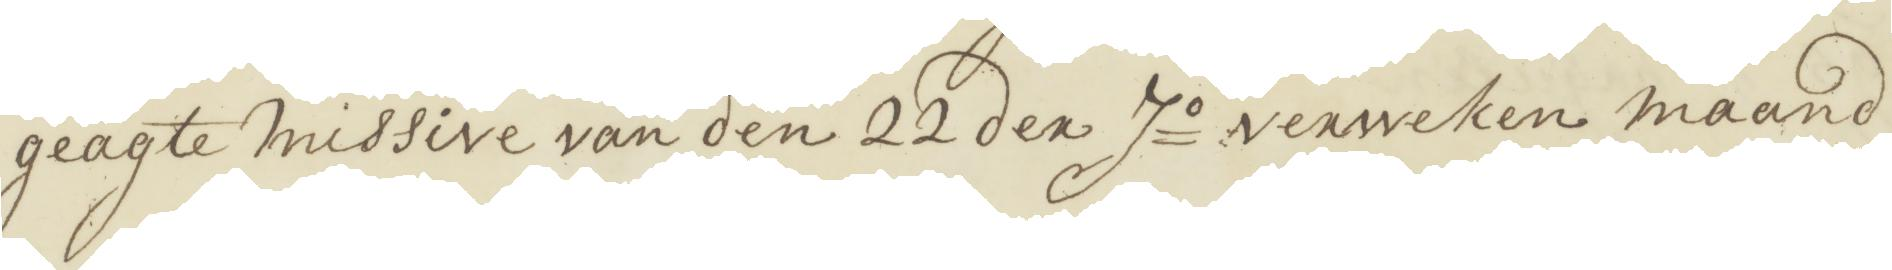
geagte missive van den 22 der J=o verweken maand
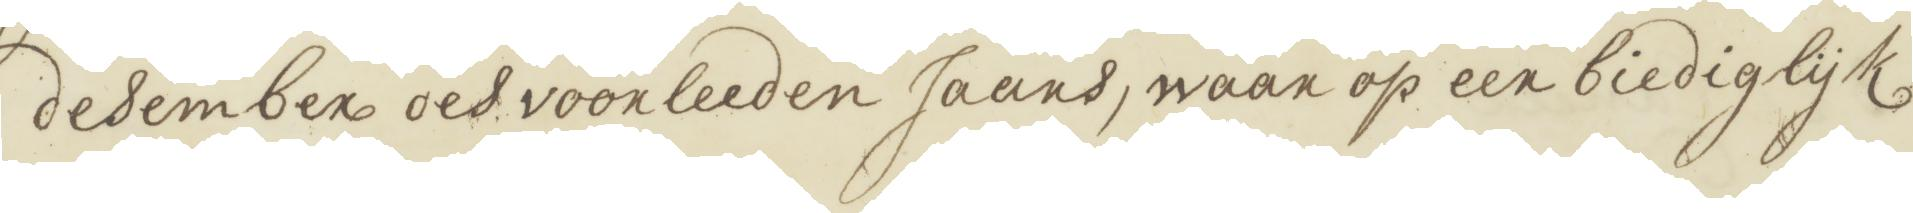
desember des voorleeden Jaars, waar op eer biediglijk
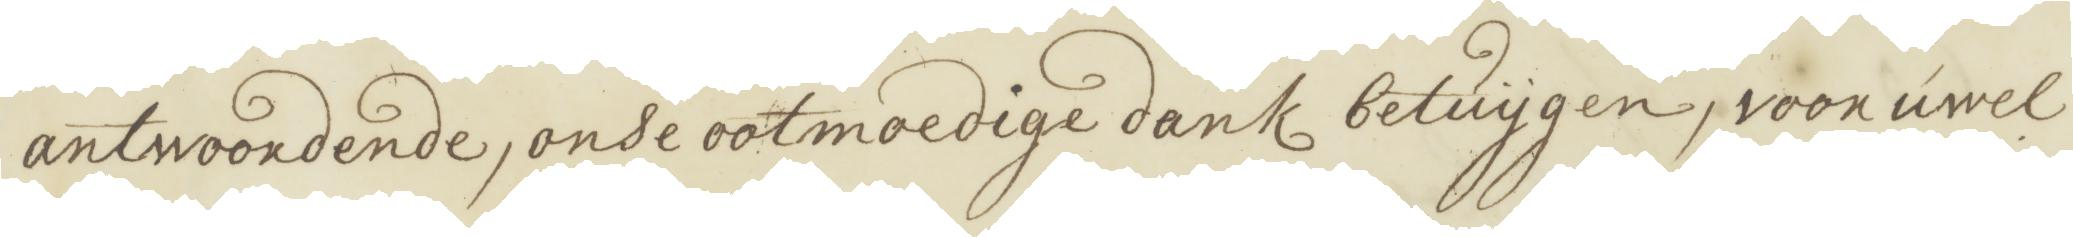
antwoordende, onse ootmoedige dank betuijgen, voor uwel
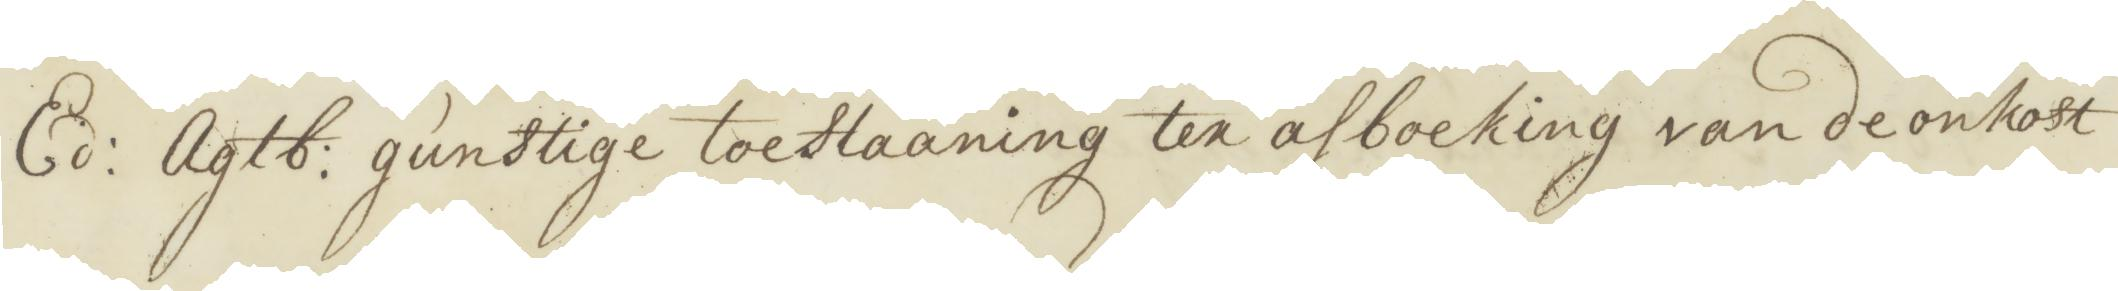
Ed: Agtb: gunstige toestaaning ter afboeking van de onkost
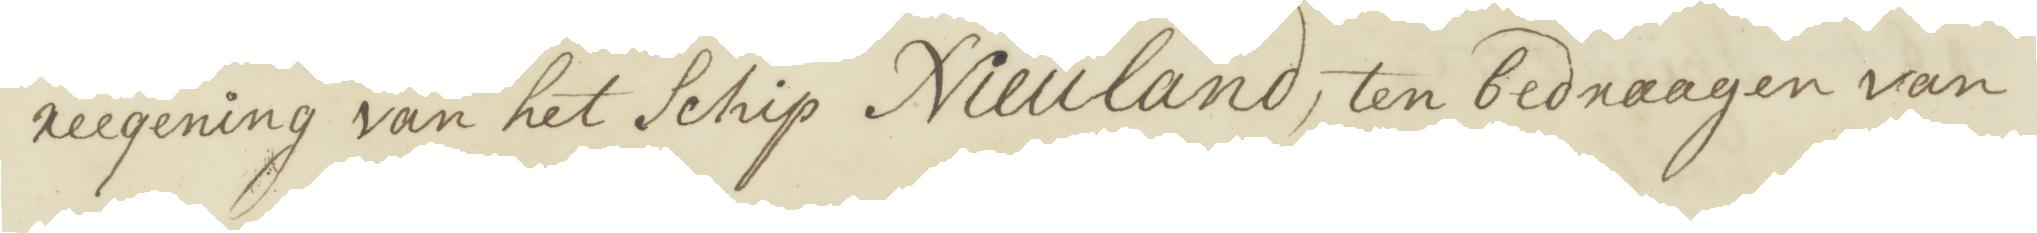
reeqening van het schip Nieuland, ten bedraagen van
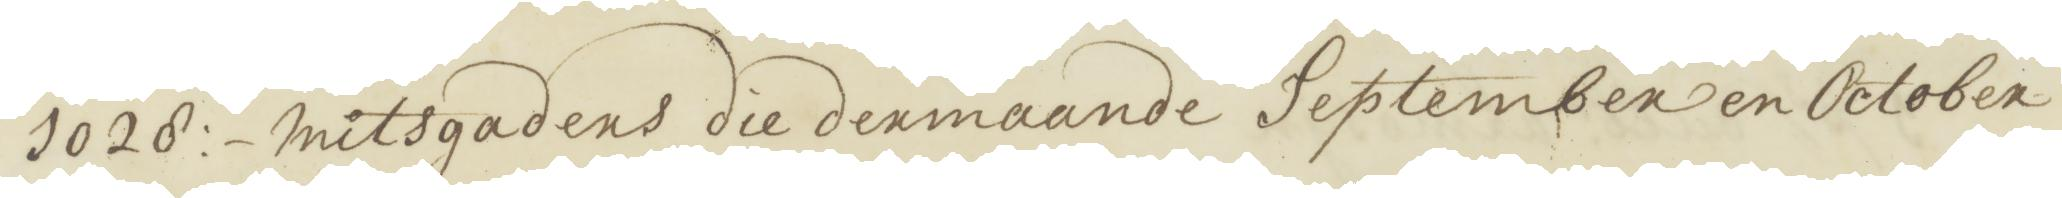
1028:- mitsgaders die dermaande September en October
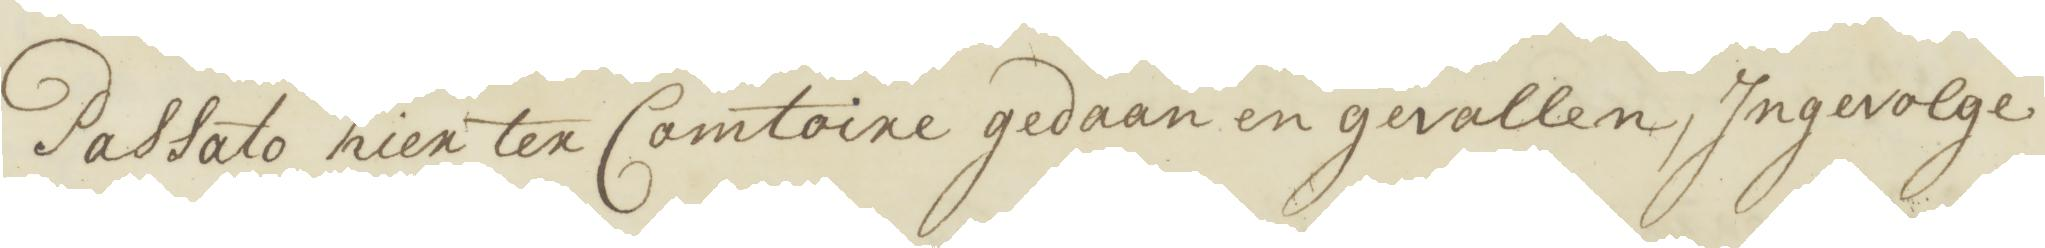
Passato hier ter Comtoire gedaan en gevallen, Jngevolge
